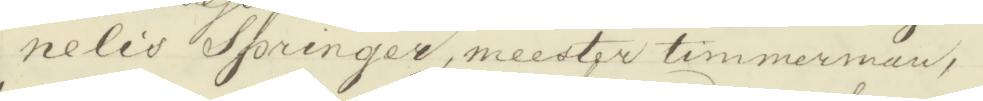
nelis Springer, meester timmerman,
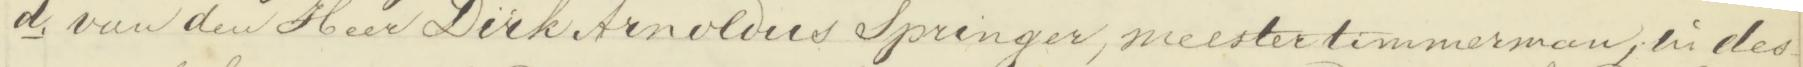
d: van den Heer Dirk Arnoldus Springer, meester timmerman, in des
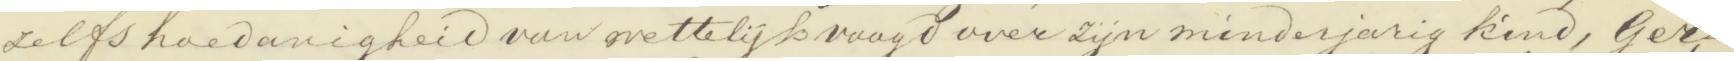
zelfs hoedanigheid van wettelijk voogd over zijn minderjarig kind, Ger=
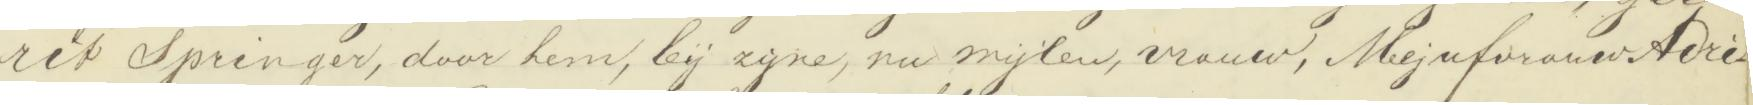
rit Springer, door hem, bij zijne, nu wijlen, vrouw, Mejufvrouw Adri=
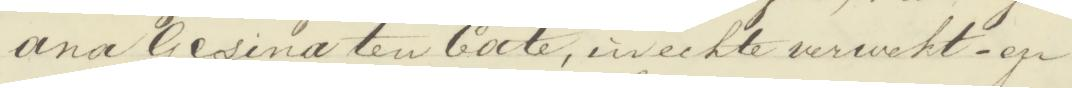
ana Gesina ten Cate, in echte verwekt en
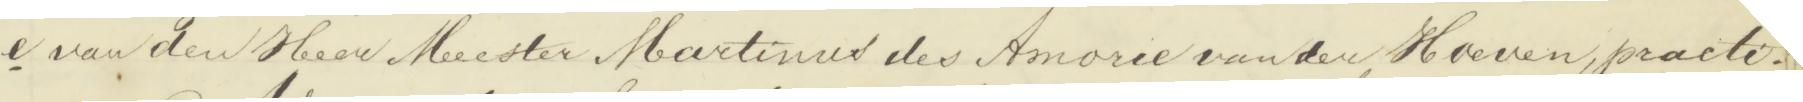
e van den Heer Meester Martinus des Amorie van der Hoeven, practi„
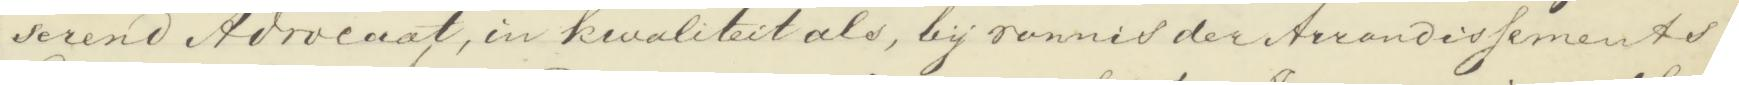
serend Advocaat, in kwaliteit als, bij vonnis der Arrondissements
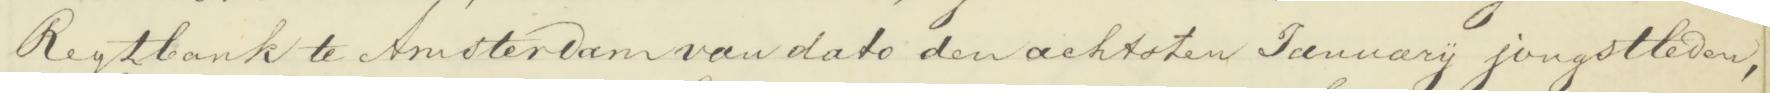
Regtbank te Amsterdam van dato den achtsten Ianuarij jongstleden,
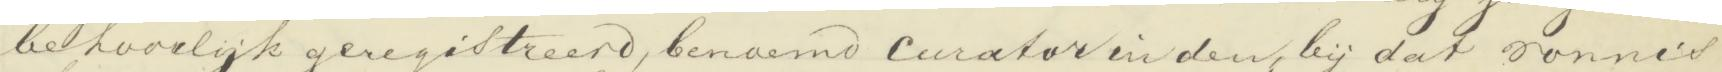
behoorlijk geregistreerd, benoemd curator in den, bij dat vonnis
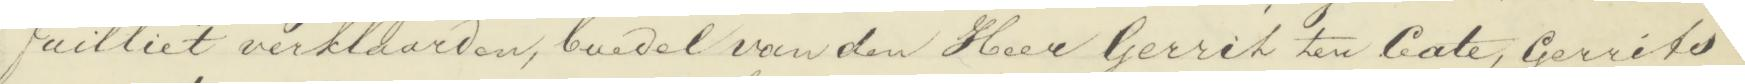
failliet verklaarden, boedel van den Heer Gerrit ten Cate, Gerrits
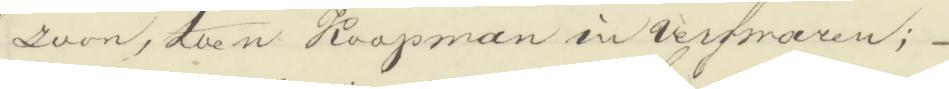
zoon, toen Koopman in verfwaren;
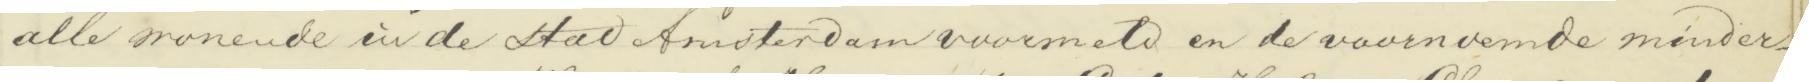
alle wonende in de stad Amsterdam voormeld en de voornoemde minder„
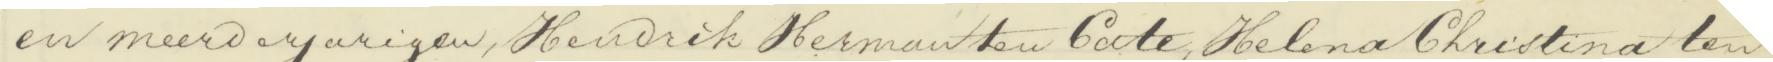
en meerderjarigen, Hendrik Herman ten Cate, Helena Christina ten
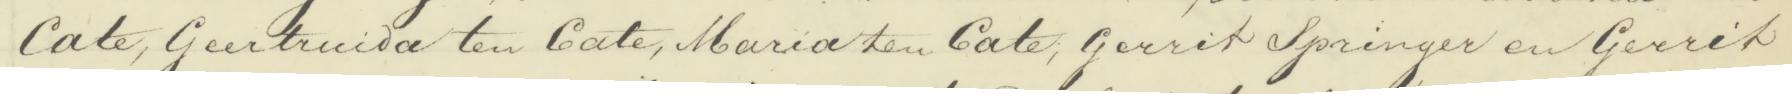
Cate, Geertruida ten Cate, Maria ten Cate, Gerrit Springer en Gerrit
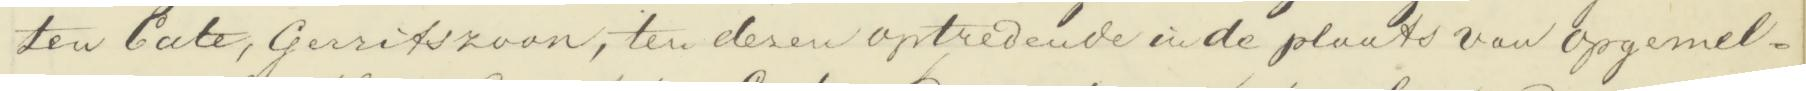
ten Cate, Gerritszoon, ten dezen optredende in de plaats van opgemel=
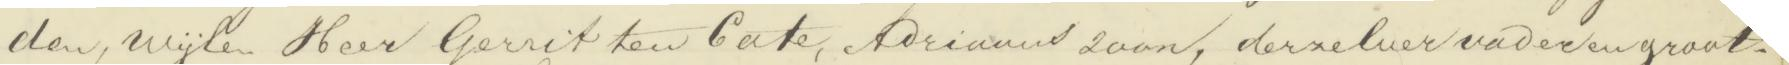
den, wijlen Heer Gerrit ten Cate, Adriaans zoon, derzelver vader en groot
